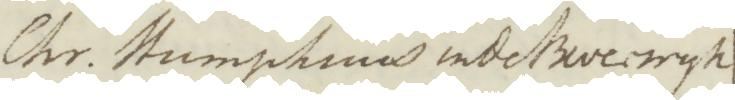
Chr. Stumphius in de Beverwyk
